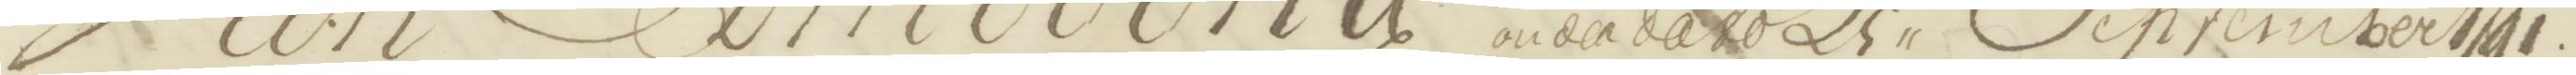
Van Amboina onder dato 25„' September 1741.
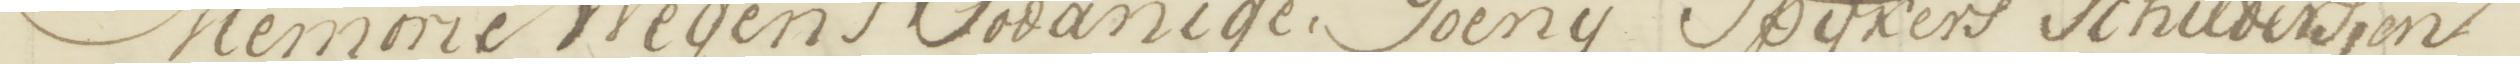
Memorie Wegens sodanige Goenij spijkers schilders, en
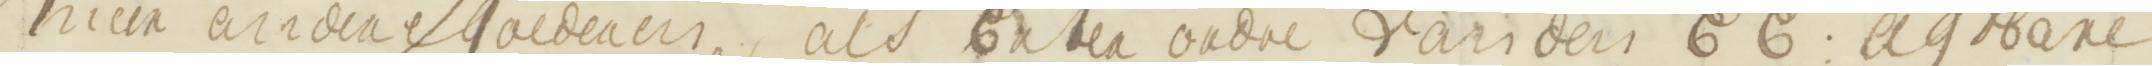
meer andere goederen als Extra ordre van den E E: agtbare
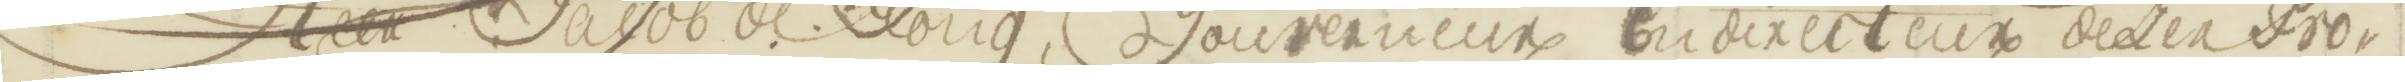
Heer Jacob de Jong, Gouverneur En directeur dezer Pro„
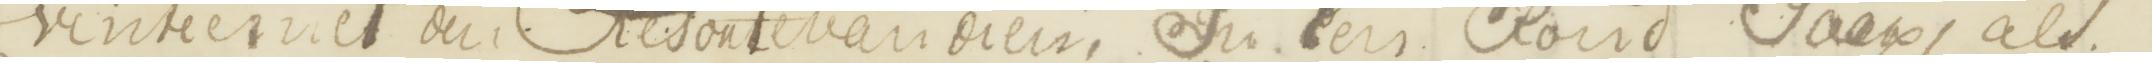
vintie met den Resorte van dien, In Een Rond Iaar, als.
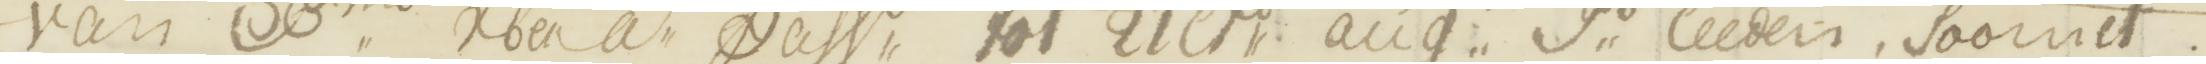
van P„mo xber a„o Pass„o tot Ult„o aug„s I„o leeden, Soo met
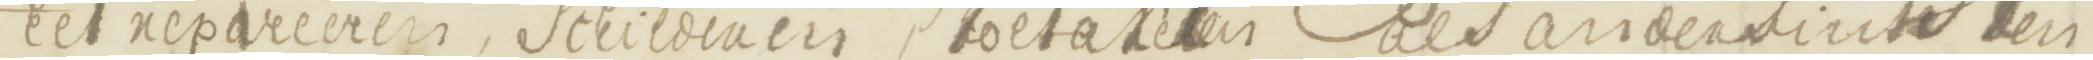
het repareeren, Schilderen, toetakelen als andersints ten
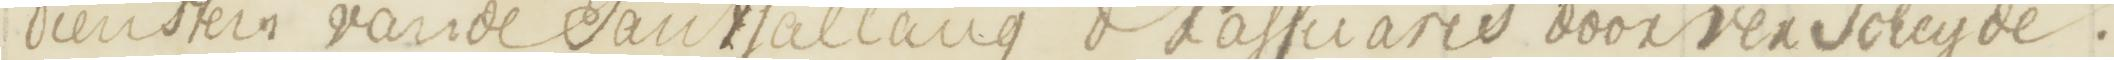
diensten van de Pantjallang d' Kassuaris door verscheijde.
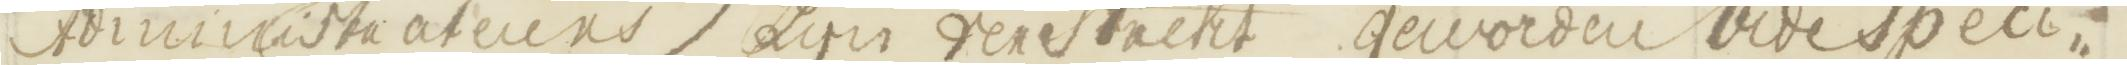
Administrateurs zyn verstrekt geworden vide Speci„
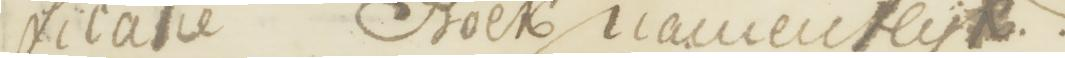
ficatie Boek namentlijk..
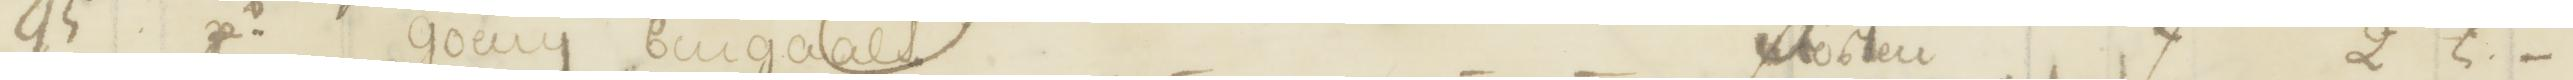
45 p=s goenij bengaals- - - - - kosten ƒ 2 5. —
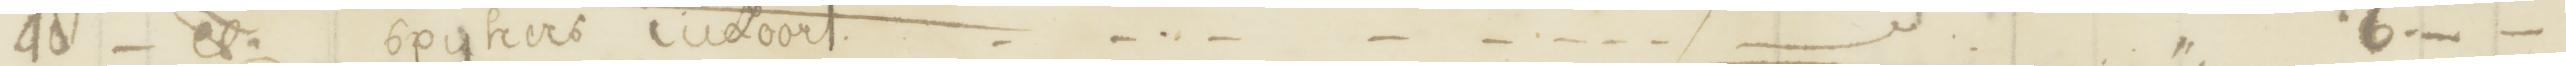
48 - lb: spijkers in Zoort- - - - - - - - _' „ 6. — —
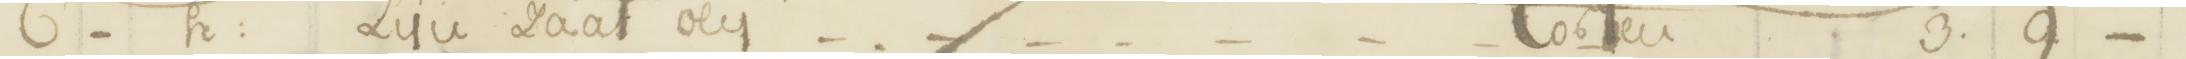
6 - k: Lijn zaat olij- - - - - - - costen 3. 9 —
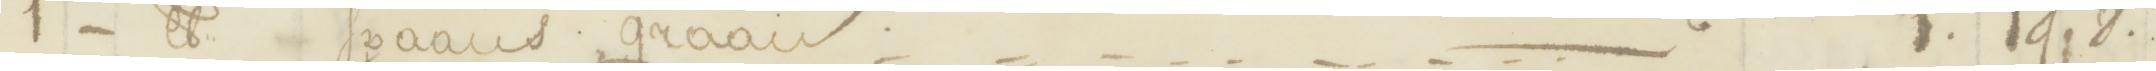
1 - lb: spaans graan: - - - - - - - - - - - —:o 1. 19. 8.
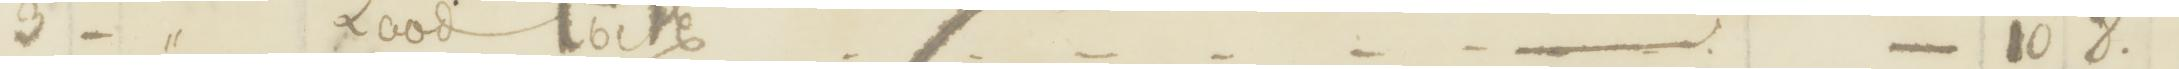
3 - „ Lood with - - - - - - - —:' — 10 8.
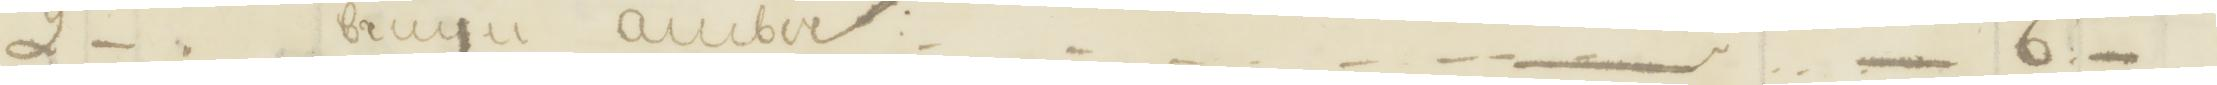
2 - „ bruijn amber - - - - - - —:' — 6: —
